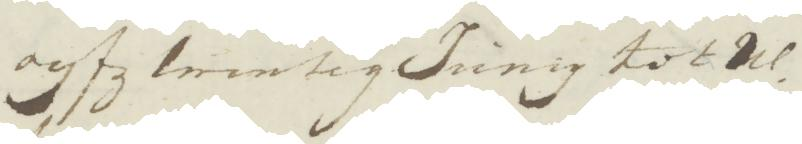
vyfen twintig Juny tot Ul,
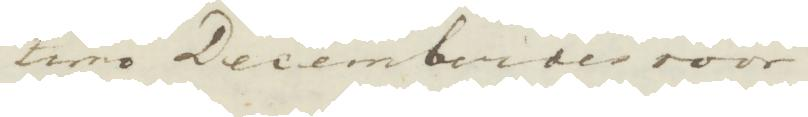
timo December des voor
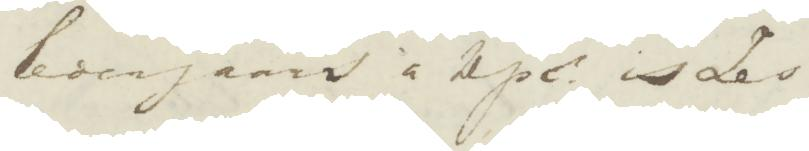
leden jaars à 4 pt. is Zes
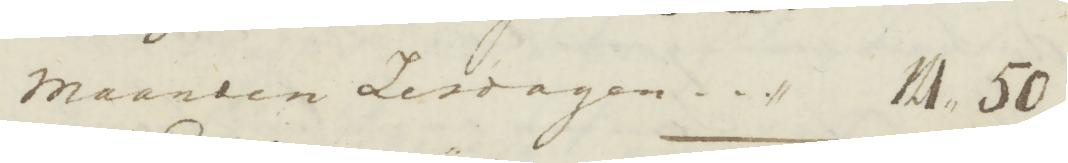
maanden Zesdagen. . „ 14„ 50
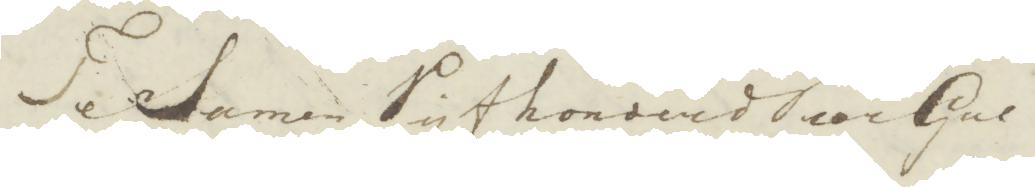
TeSamen Vyfhonderd Vier Gul
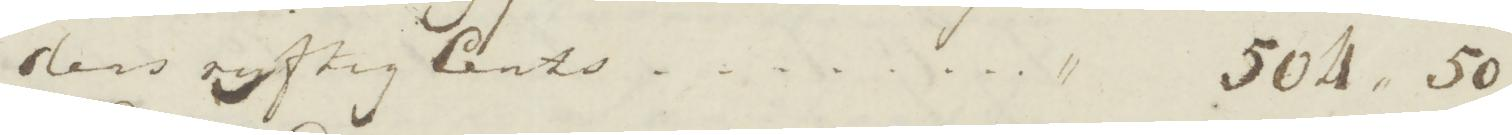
dens vyftig Cents . . . . . . . „ 504„ 50
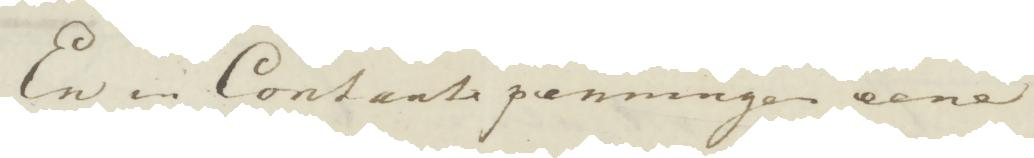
En in Contante penningen eene
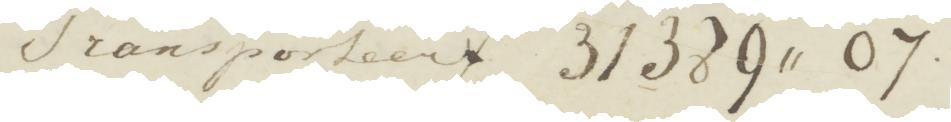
Transporteert ƒ 31389„ 07.
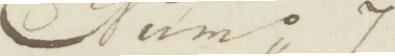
Num=o 7
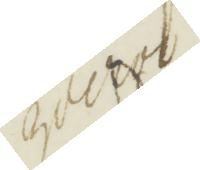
3derol
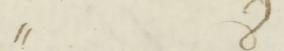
" 8
